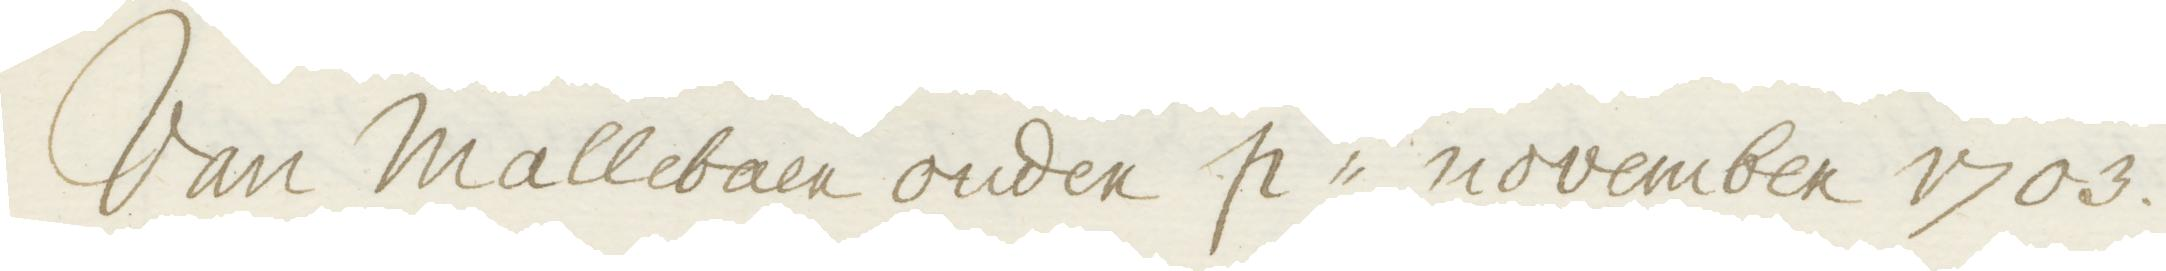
Van Mallebaer onder p„mo november 1703.
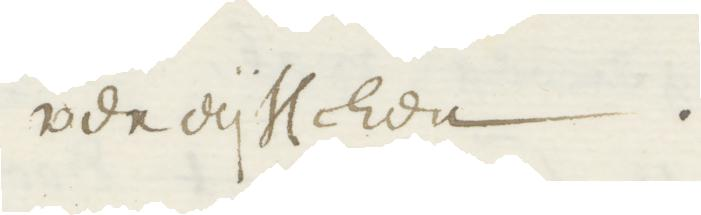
vereijsschen.
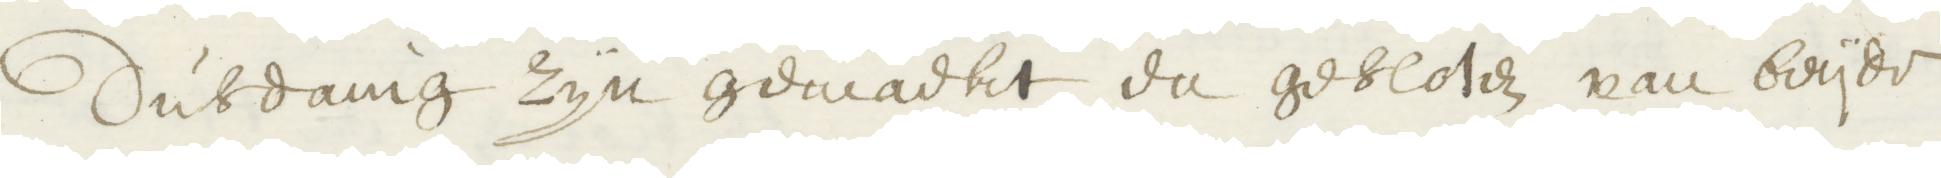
dusdanig zijn gemaekt en gesloten van beijde
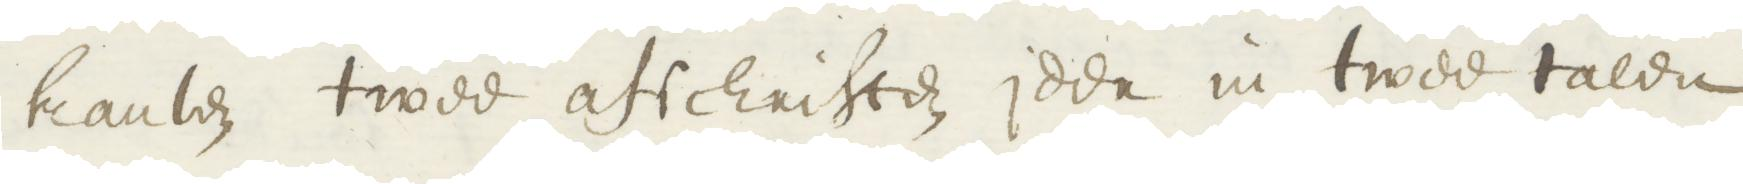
kanten twee afschriften jder in twee talen
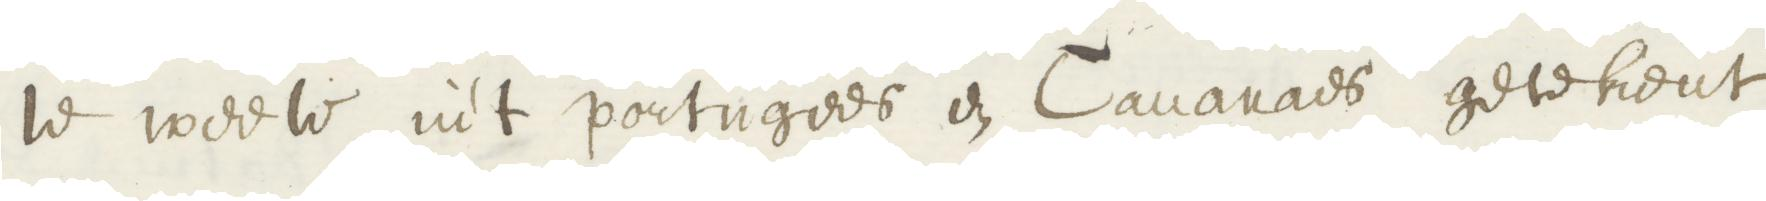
te weete in’t portugees en Canaraes getekent
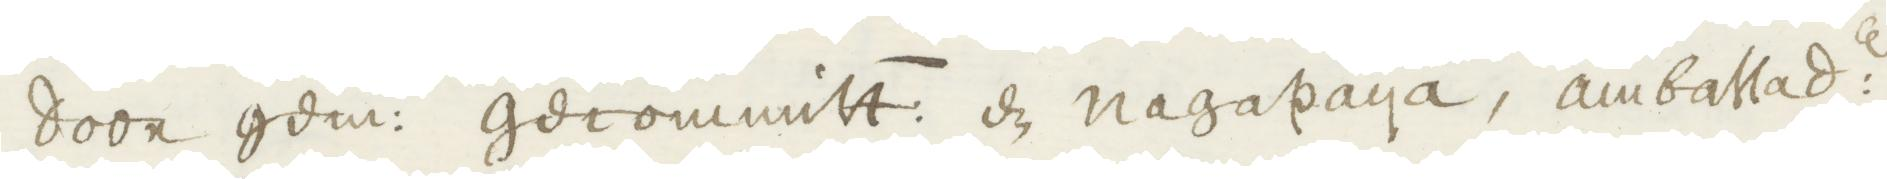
door gem: gecommitt: en nagapaija, ambassad:r
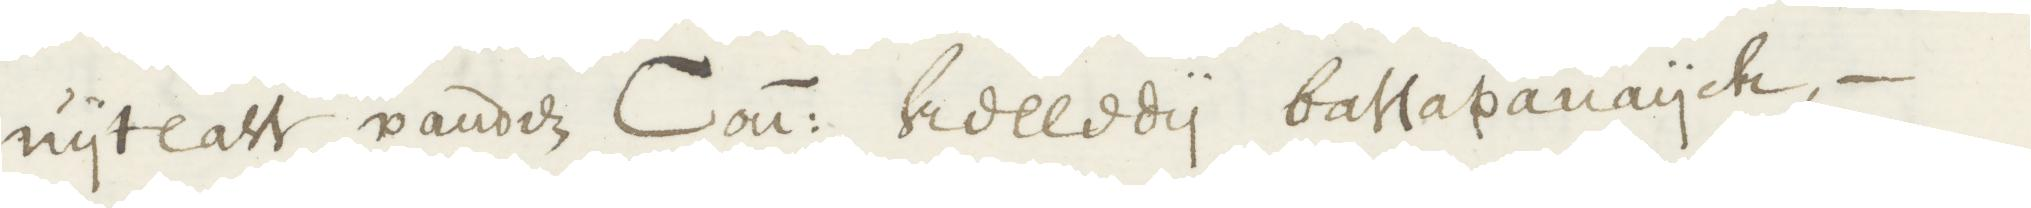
uijt last vanden Con: kelledij bassapanaijck, —
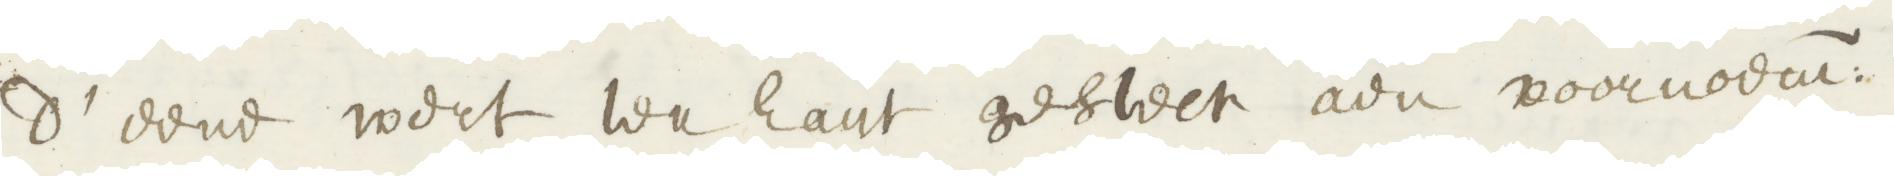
d’ eene wert ter hant gestelt aen voornoem:
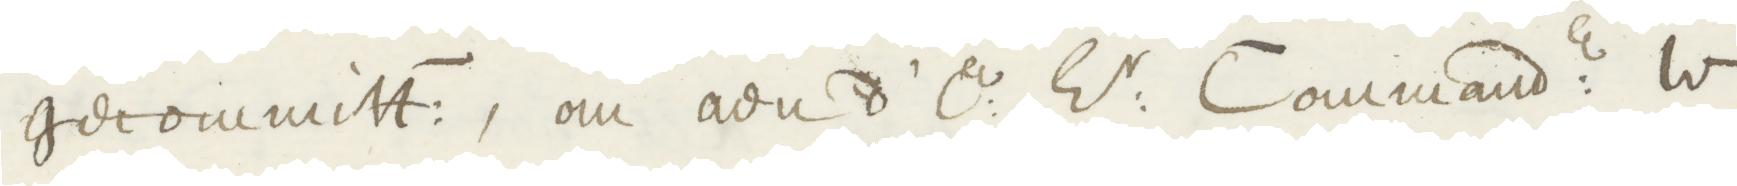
gecommitt:, om aen d’ E: h:r Command:r te
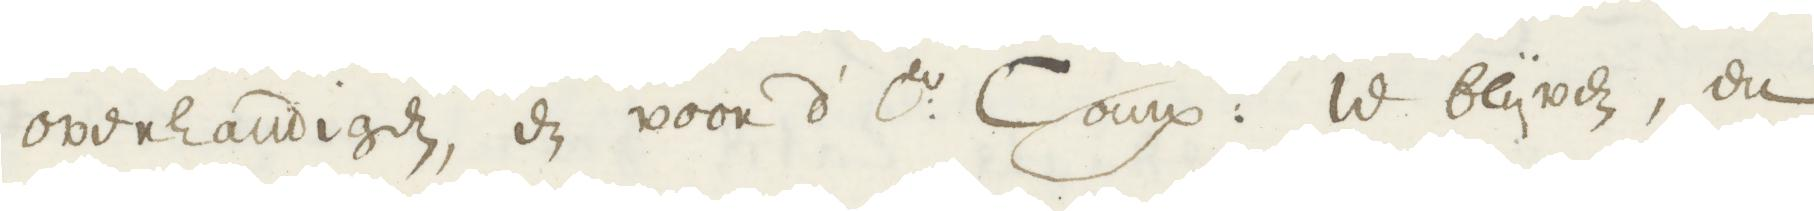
overhandigen, en voor d’ E: Comp: te blijven, en
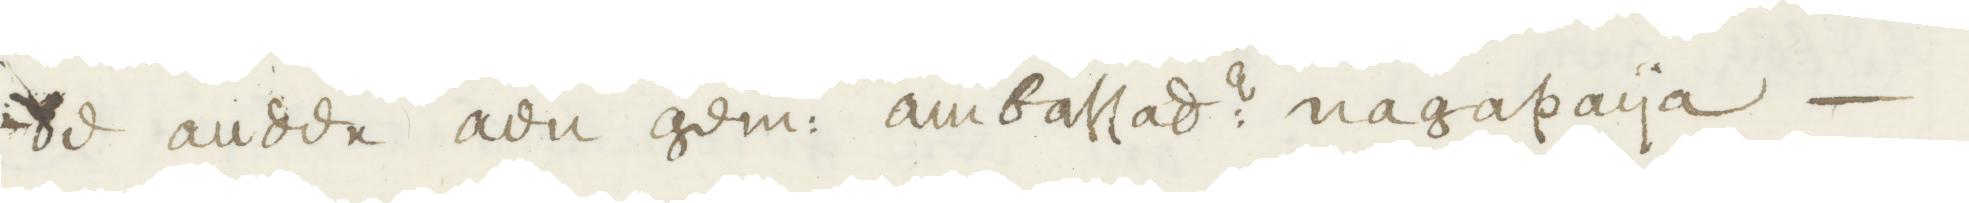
de ander aen gem: ambassad:r nagapaija —
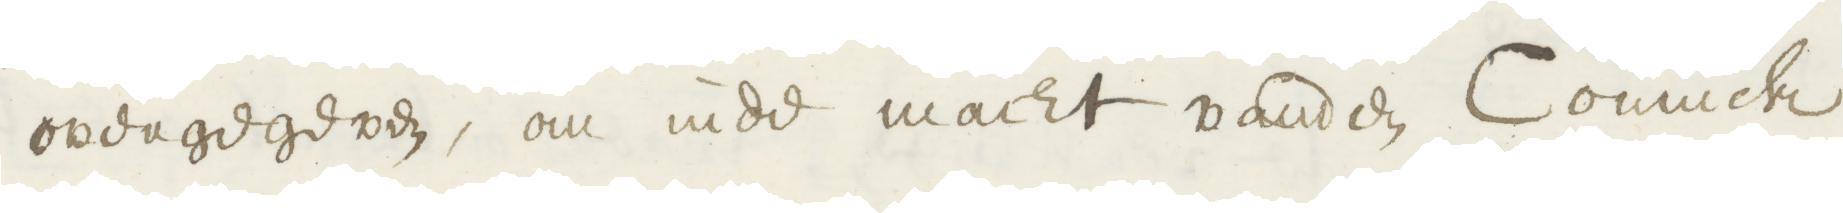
overgegeven, om inde macht vanden Coninck
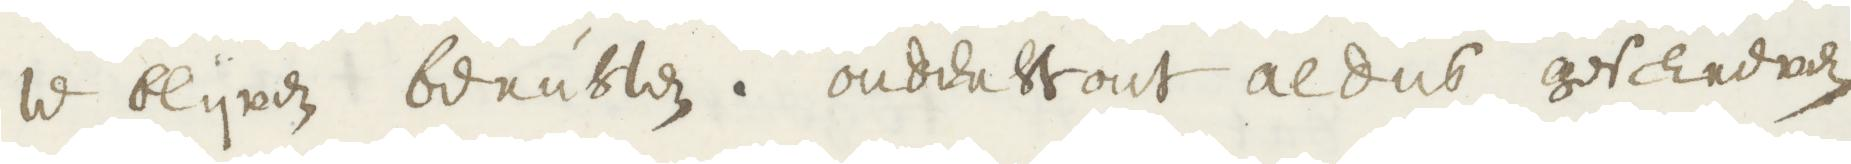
te blijven berusten. onderstont aldus geschreven
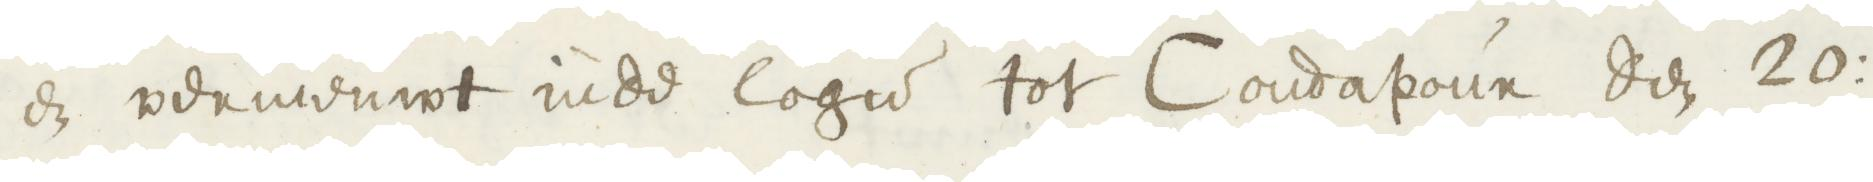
en vernieuwt inde logie tot Condapour den 20
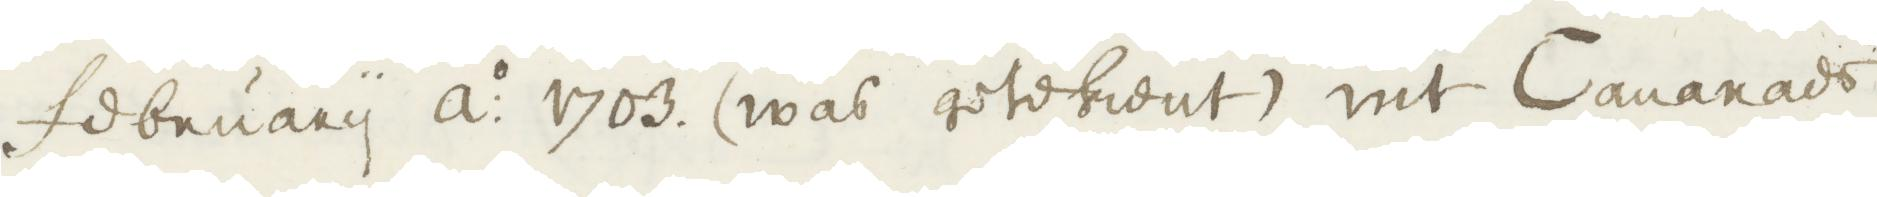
februarij a:o 1703. (was getekent) in't Canaraes
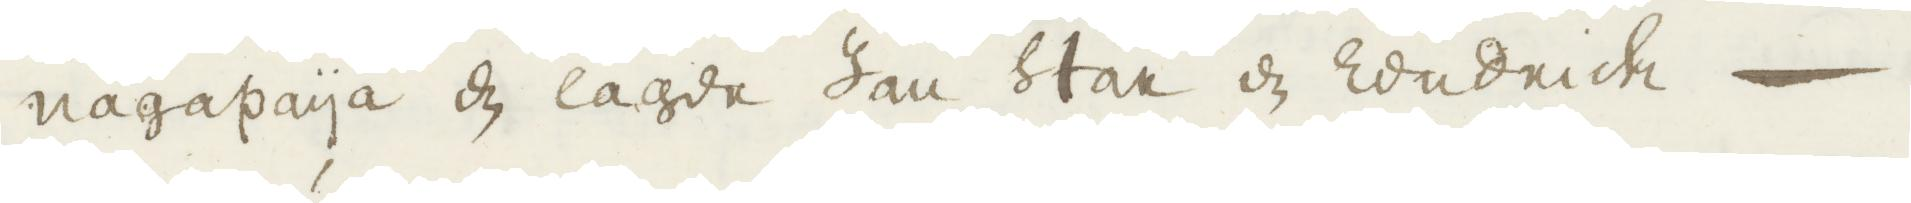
nagapaija en lager Ian star en hendrick —
